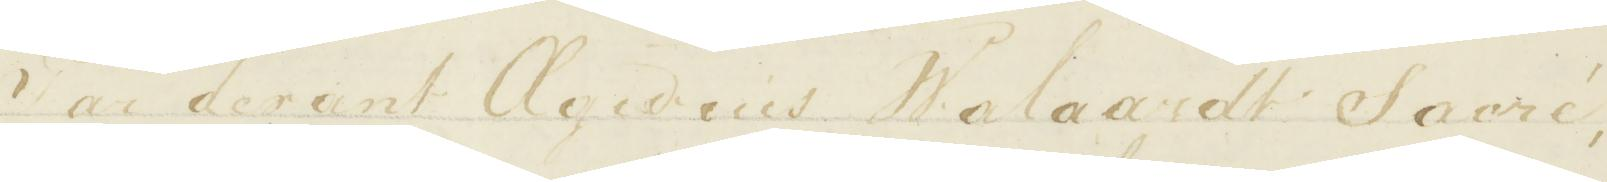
Par derant AEgideus Walaardt Sacré,
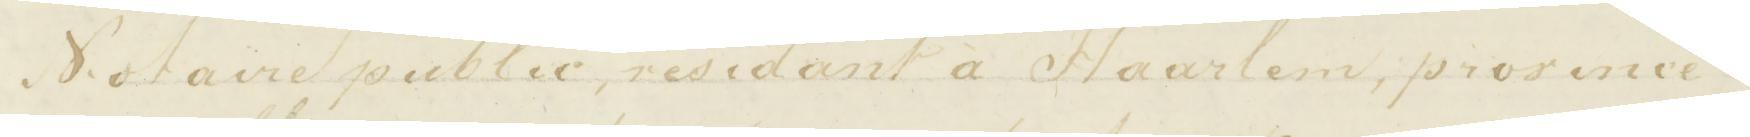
Notaire public, residant à Haarlem, province
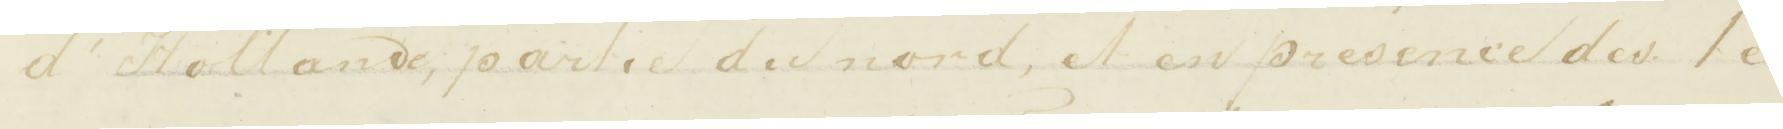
d’ Hollande, partie du nord, et en presence des te
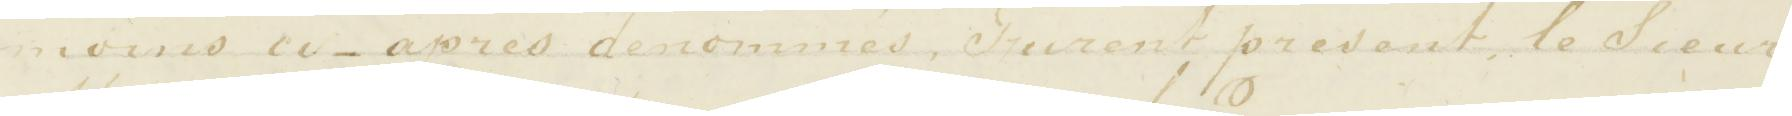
moins ci-apres denommés, Furent present, le Sieur
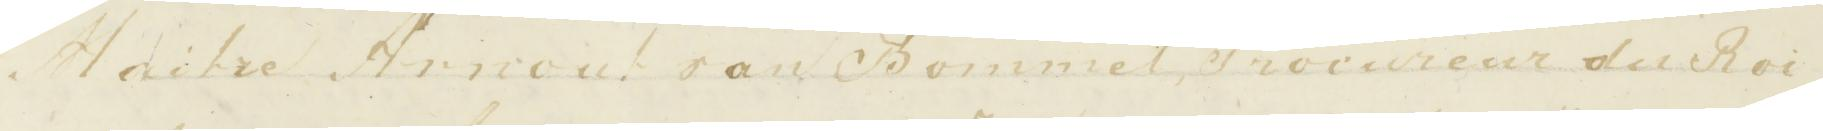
Haitre Arnout van Bommel, Procureur de Roi
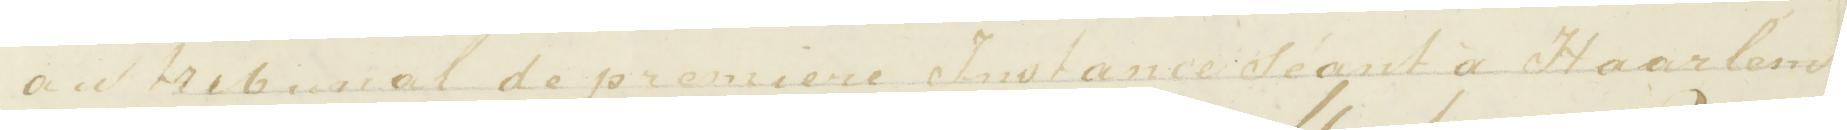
au tibunal de premiere Instance seant à Haarlem
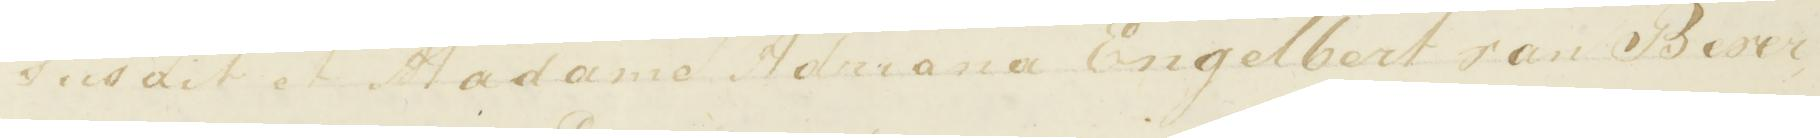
susdit et Madame Adriana Engelbert van Bever„
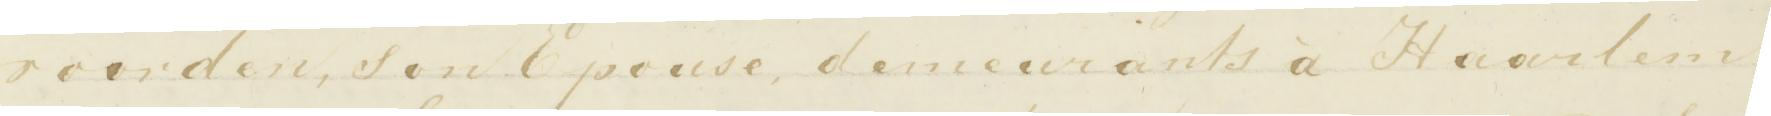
voorden, son Epouse, demeurants à Haarlem
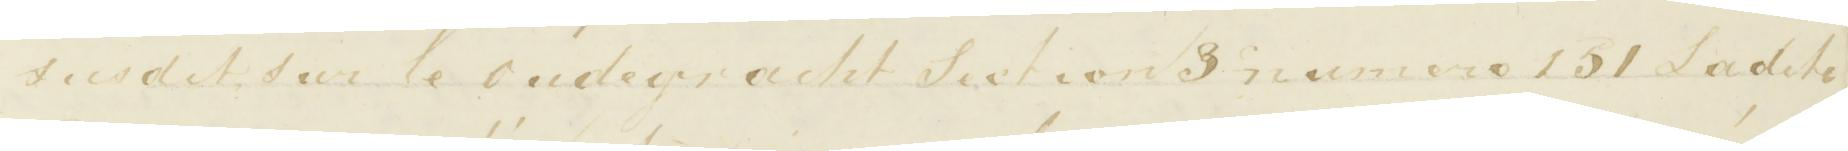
susdit sur le Oudegracht Section 3 numero 131 Ladite
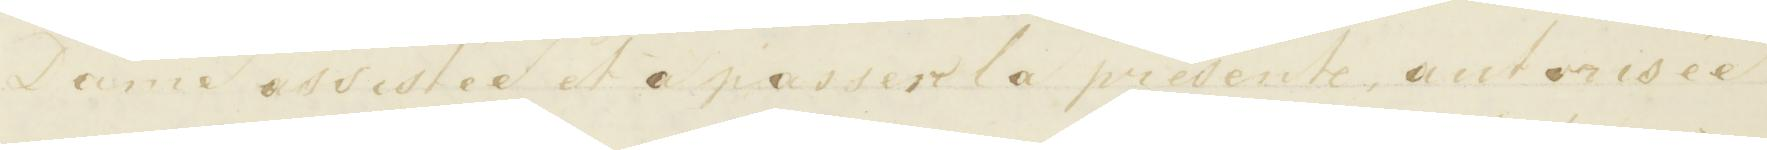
Dame assistée et a passer la presente, autorisée
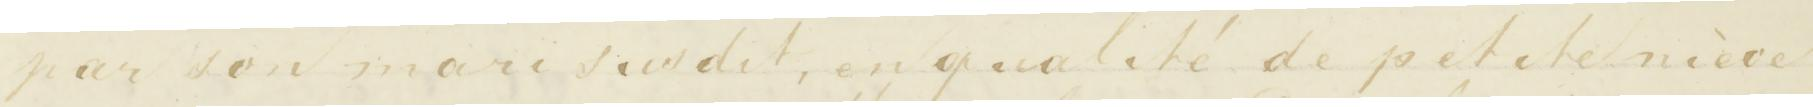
par son mari susdit, en qualité de petite nièce
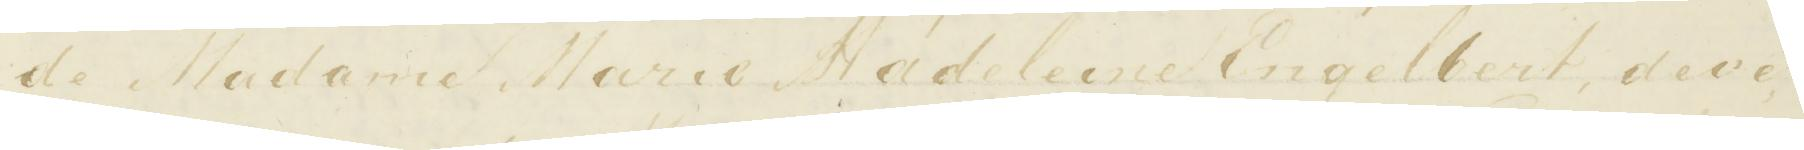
de Madame Marie Madeleine Engelbert, dece
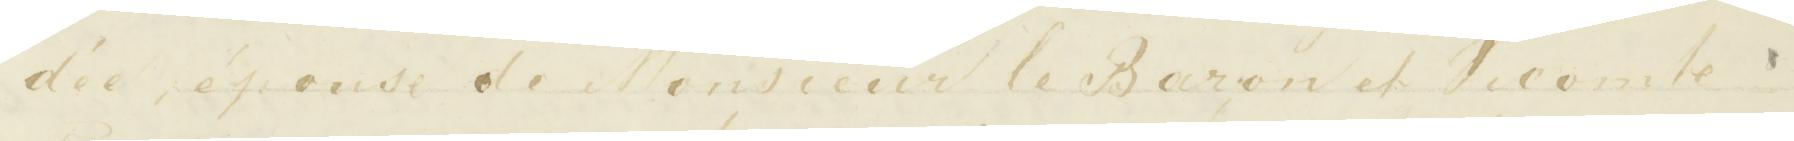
dée, épouse de Monsieur le Baron et Vicomte
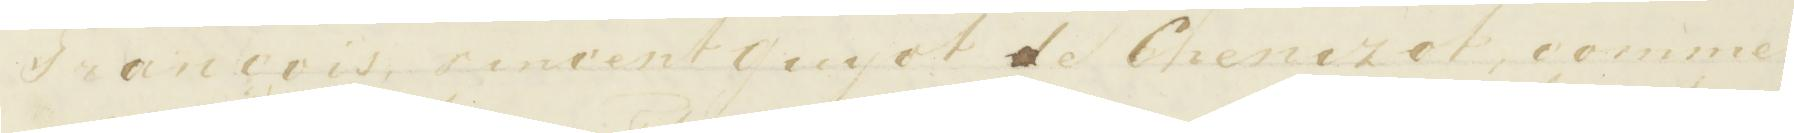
François, vincent Guyot de Chenizot, comme
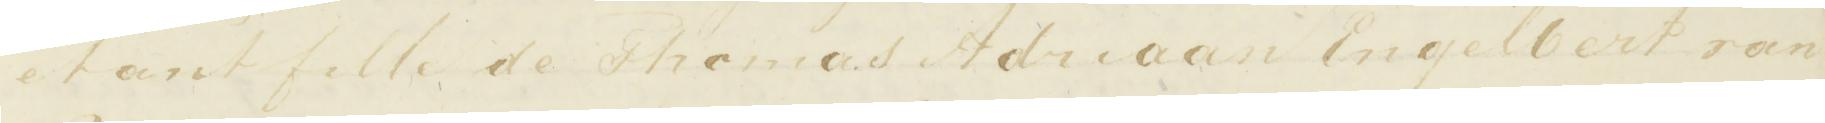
etant fille de Thomas Adriaan Engelbert van
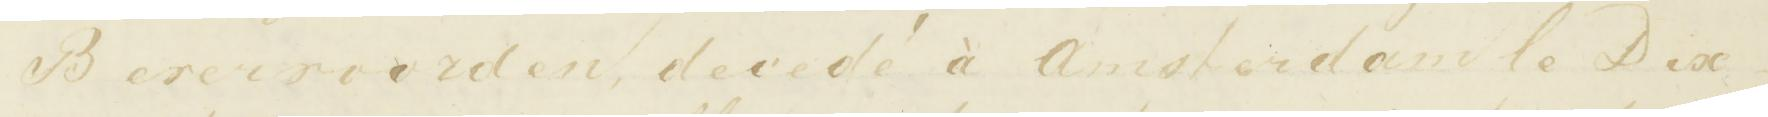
Bevervoorden, decedé à Amsterdam le Dix
